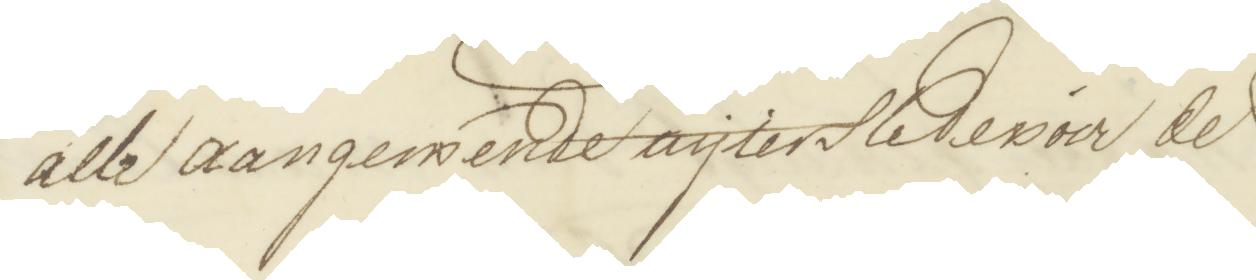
alle aangewende uijterste devoir de
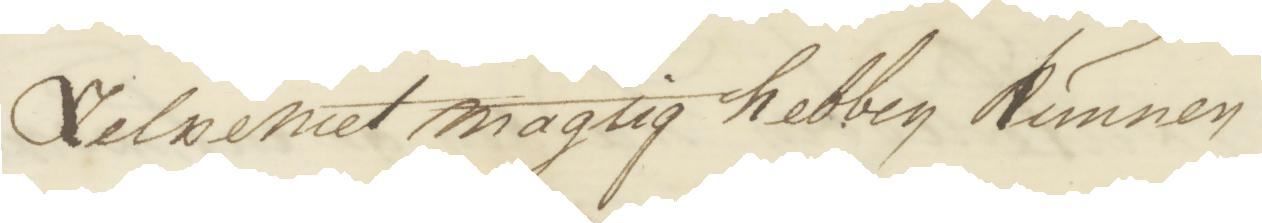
zelve niet magtig hebben kunnen
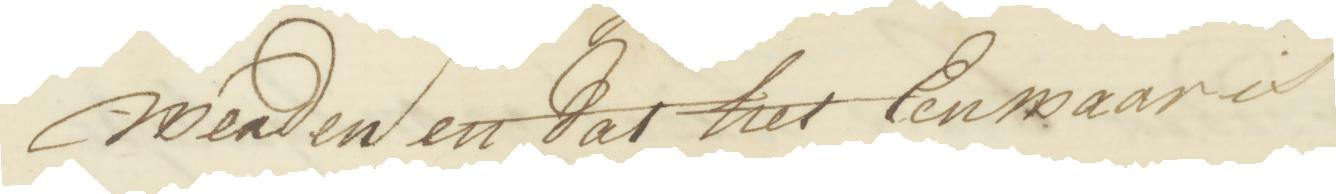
werden en dat het Een waar is
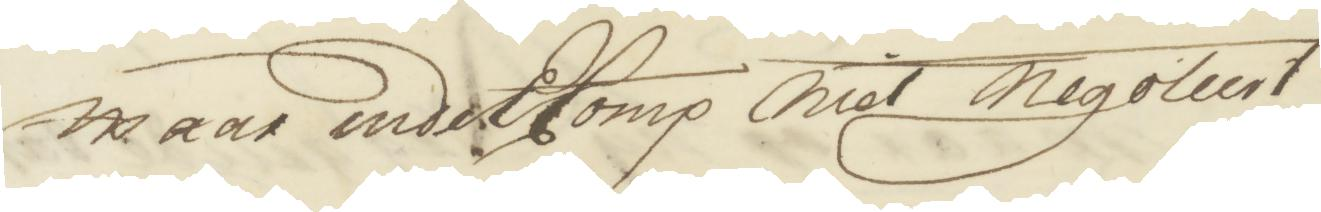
waar in de E Comp niet negoteert
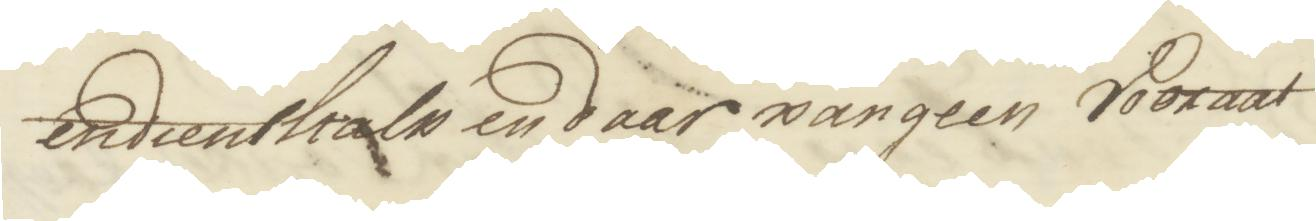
en dienthalven daar van geen vooraat
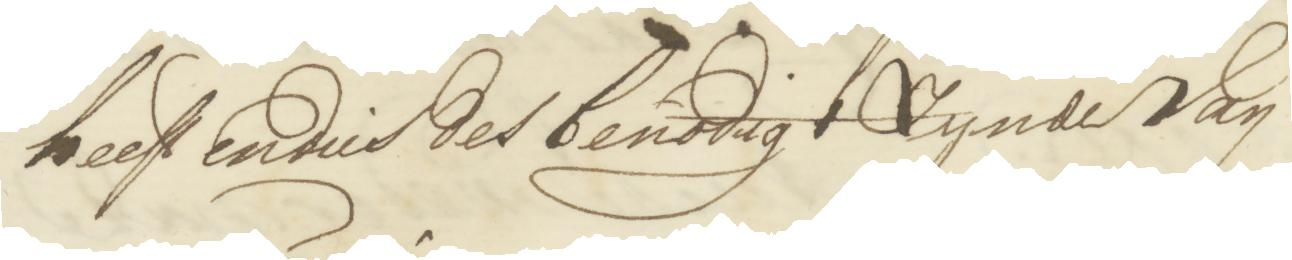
heeft en dus des benodigt zynde van
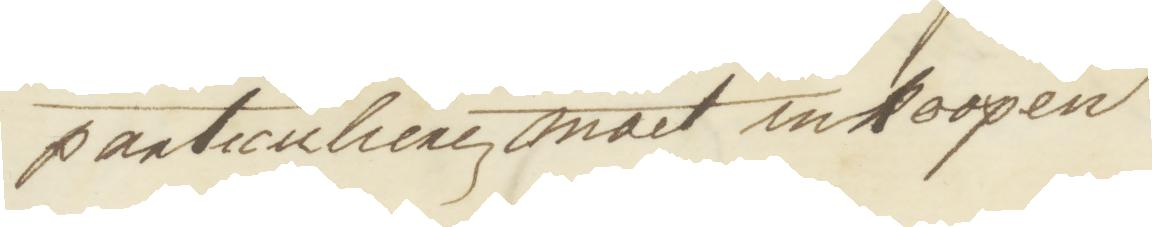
particulieren moet inkoopen
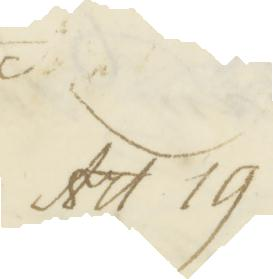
Art 19
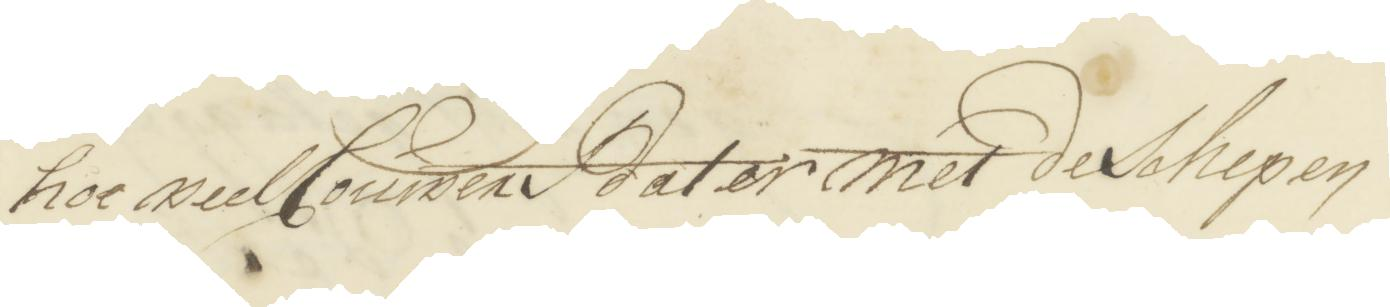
hoe veel Couwers dat er met de schepen
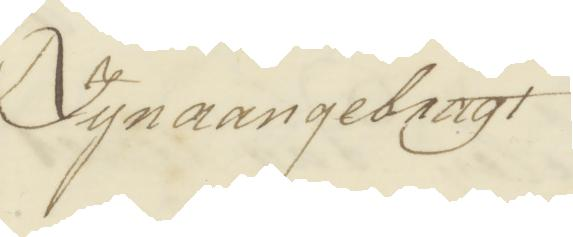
Zyn aangebragt
